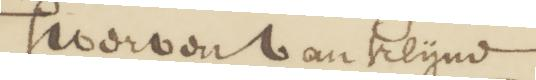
swerven van klijne
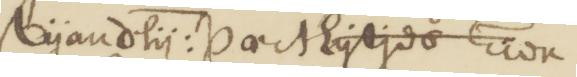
vijandlij: parthijtjes hier
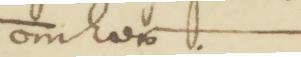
om her.
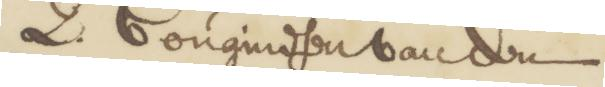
2. bouginesen van den
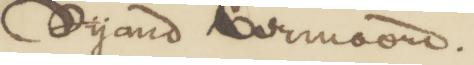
vijand vermoord.
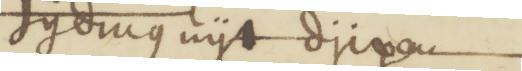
tijding uijt djipan
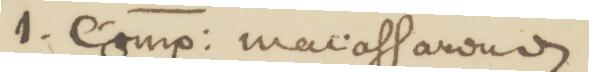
1. Comp: macassarenen
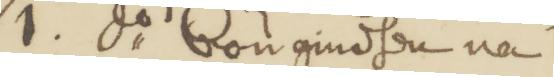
1. d„o bouginesen na
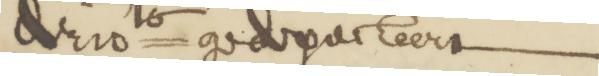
derw=ts gedepatheert
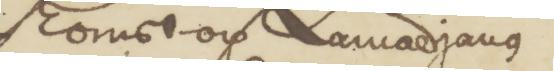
komst op Lamadjang
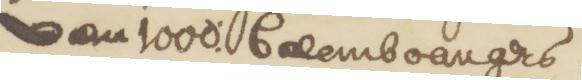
van 1000: balemboangers
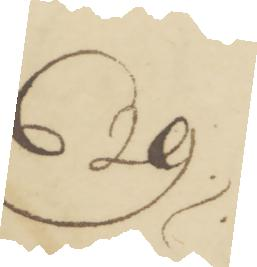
629.
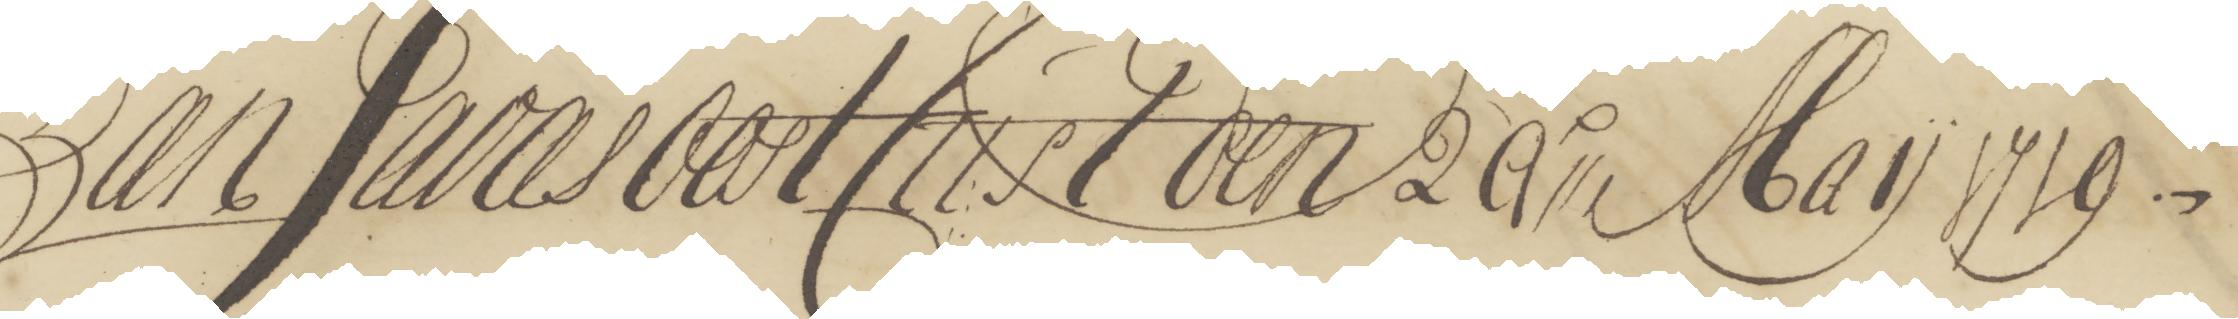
Van Java's Oost Cust den 24„e Maij 1719. —
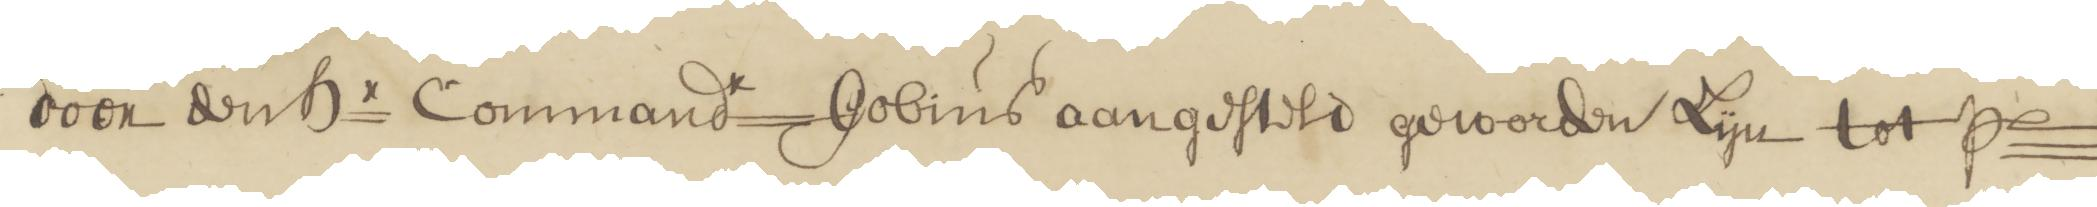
door den H=r Command=r Gobius aangesteld geworden zijn tot p=e
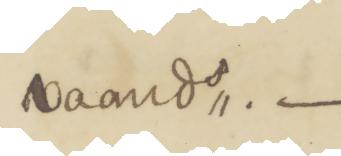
vaand„s. —
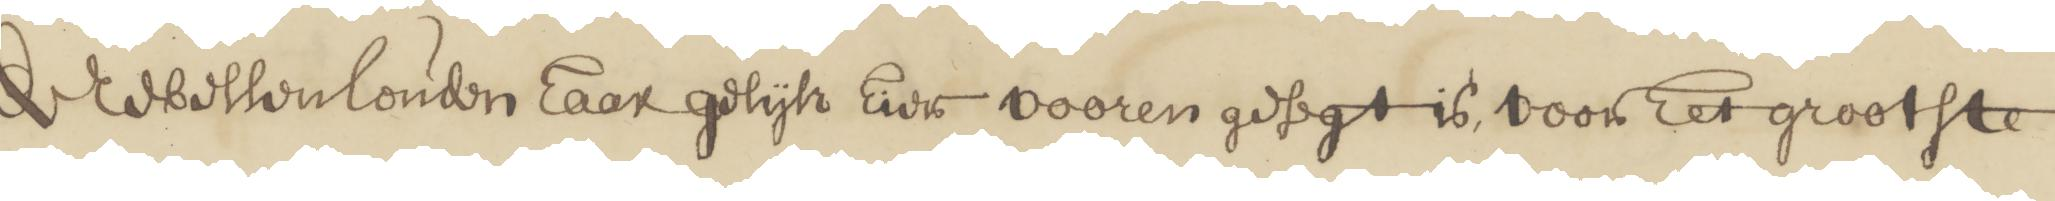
De rebellen houden haar gelijk hier vooren gesegt is, voor het grootste
